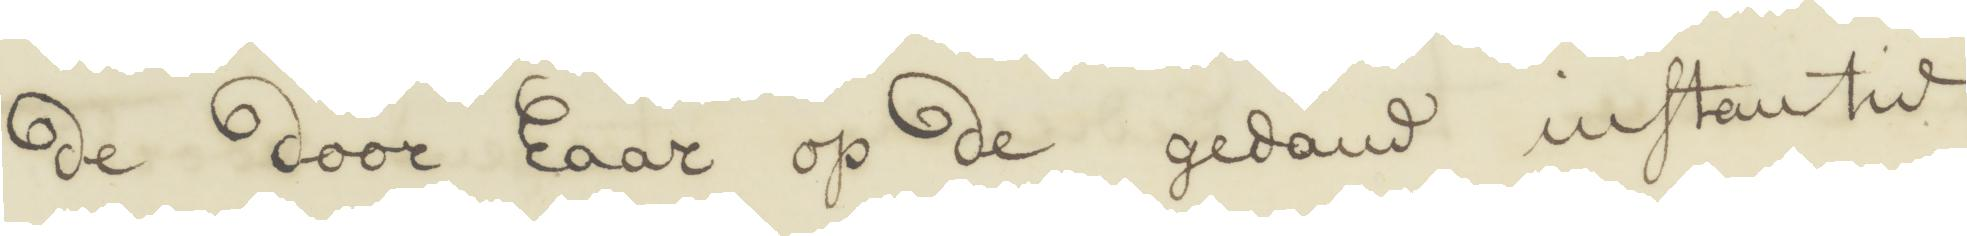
de door haar op de gedane instantie
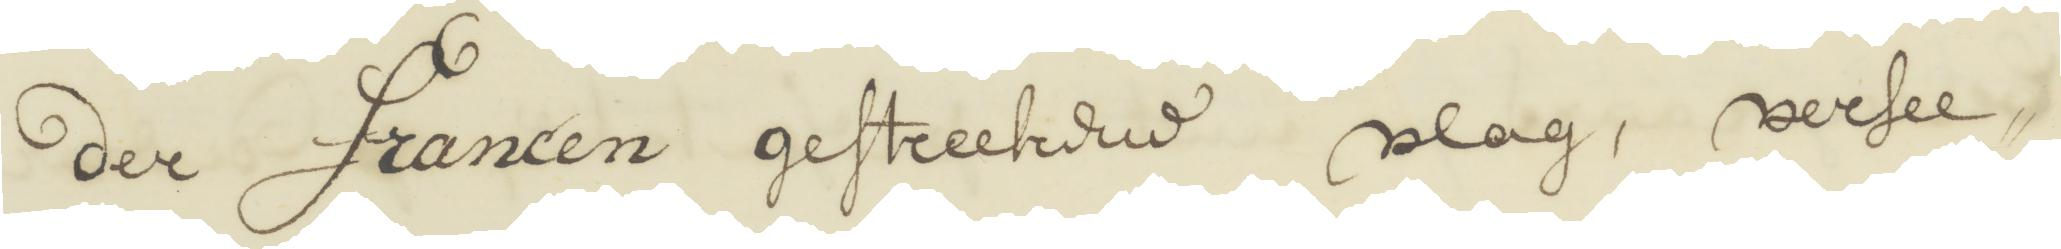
der francen gestreekene vlag, versee„
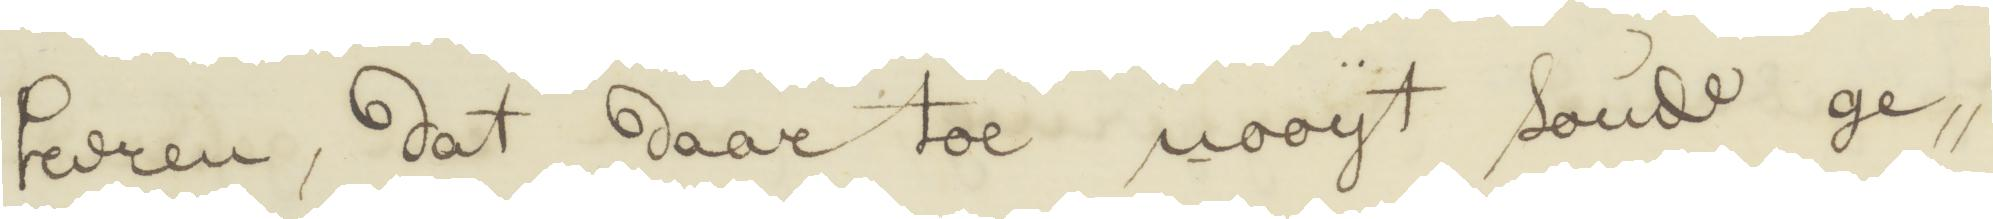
keren, dat daar toe nooijt soude ge„
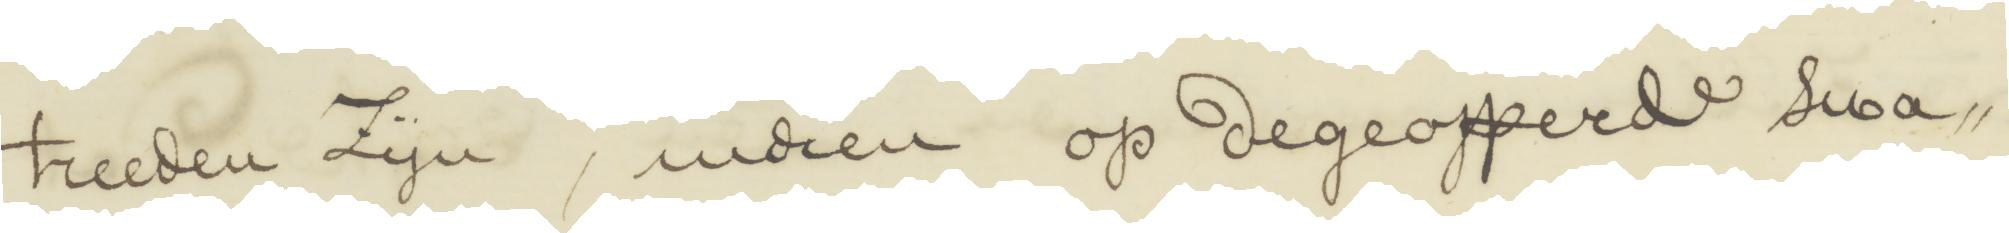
treeden zijn, indien op de geopperde swa„
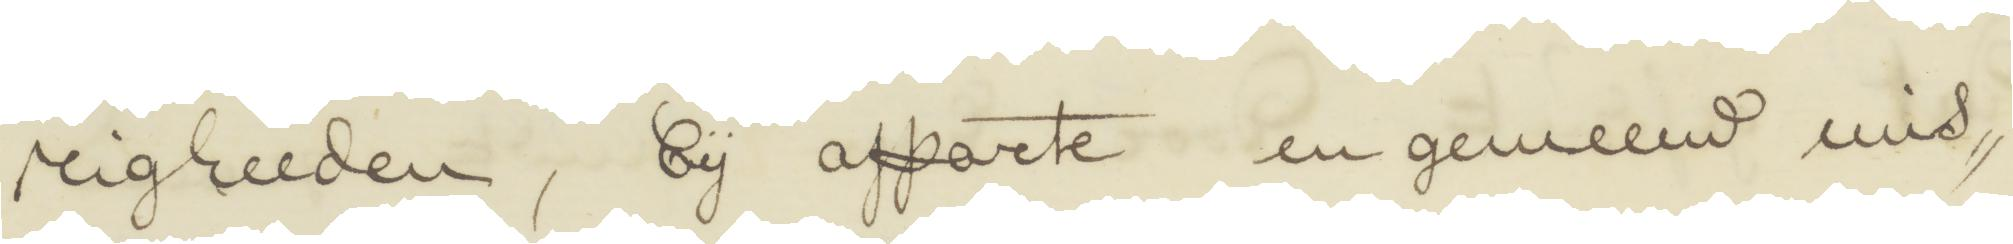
righeeden, bij apparte en gemeene mis„
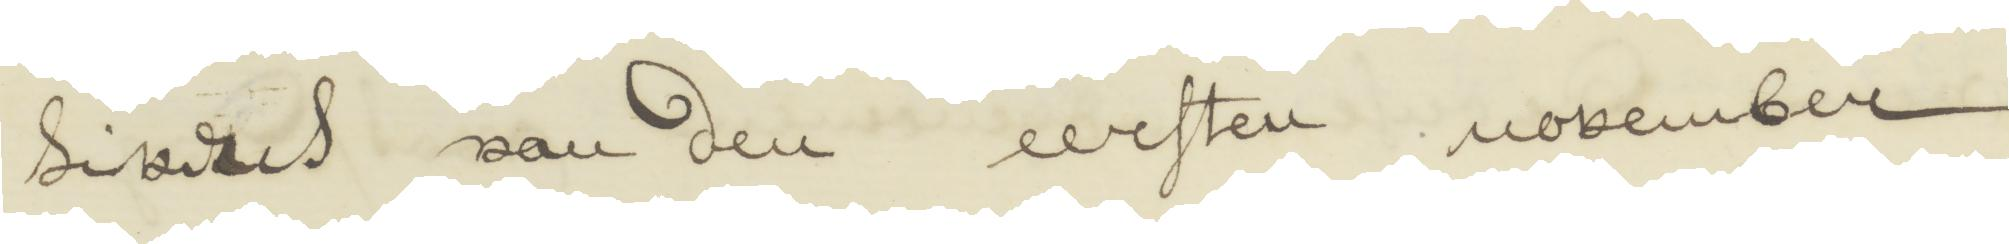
sivens van den eersten november
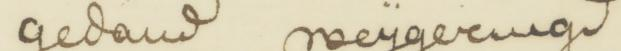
gedane weijgeringe
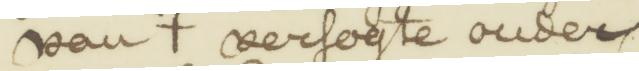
van ’t versogte onder
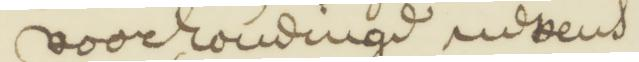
voorhoudinge nevens
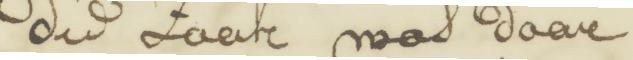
die zaak was daar
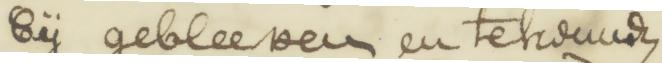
bij gebleeven en te kennen
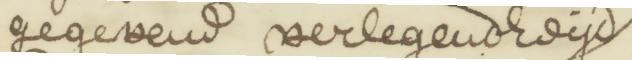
gegevene verlegendheijd
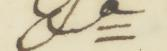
&=a
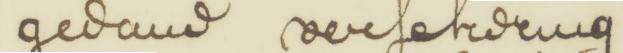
gedane versekering
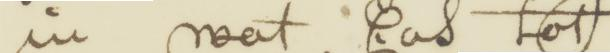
in wat Cas tot
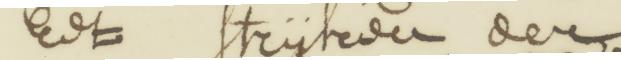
het strijken der
